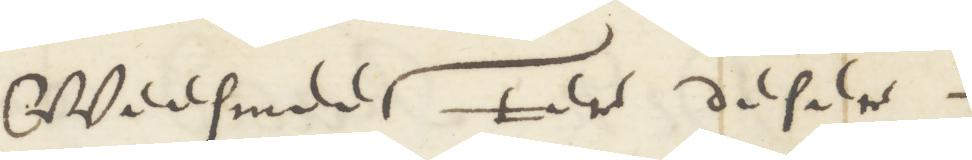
Weesmeester deser
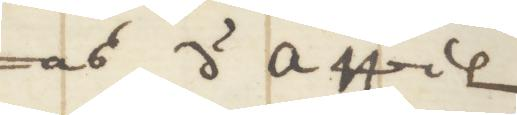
cas d' appel
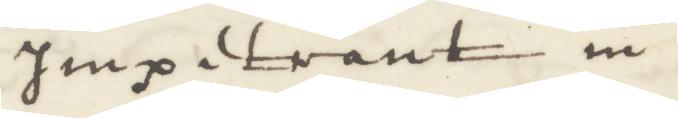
Jmpetrant in
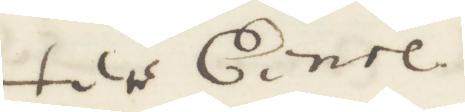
ter Eenre
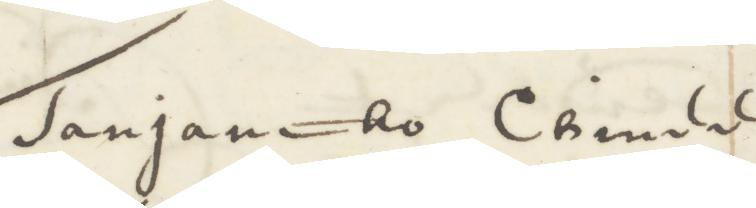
Tanjancko Chinee
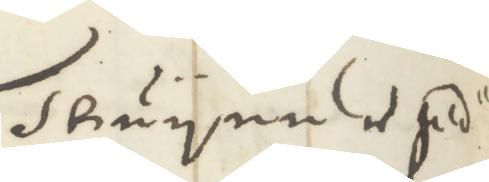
Thuijnier ged
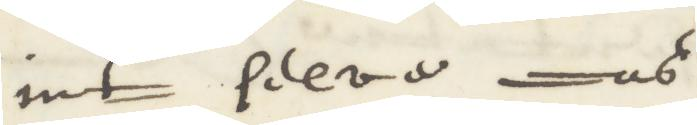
int selve cas
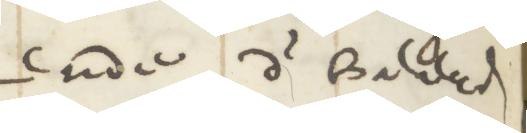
ende d’ heeren
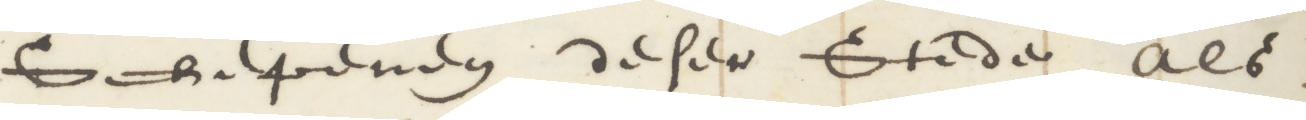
Schepenen deser Stede als
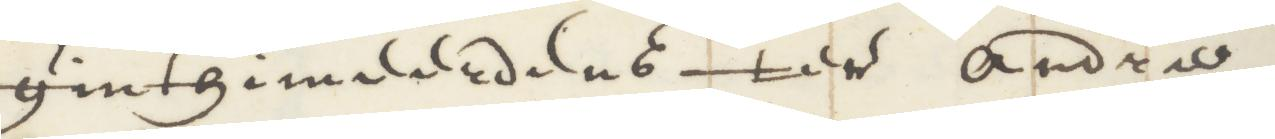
g'inthimeerdens ter andre
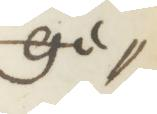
ge„
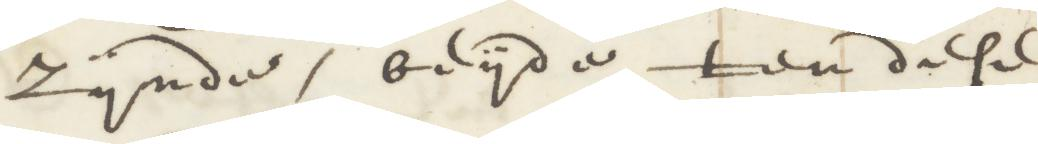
zijnde, beijde ten dese
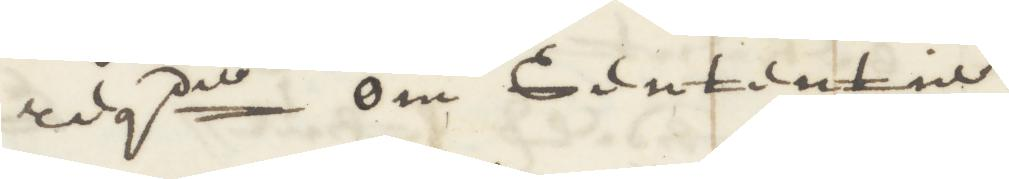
req=de om Sententie
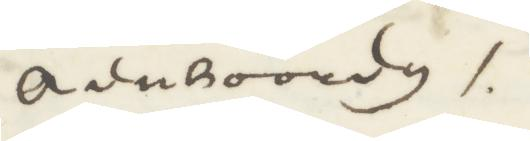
aenhooren/.
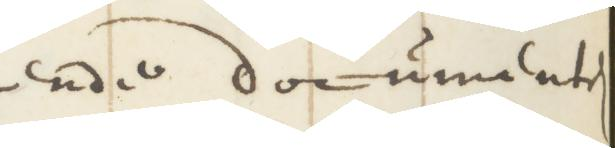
ende documenten
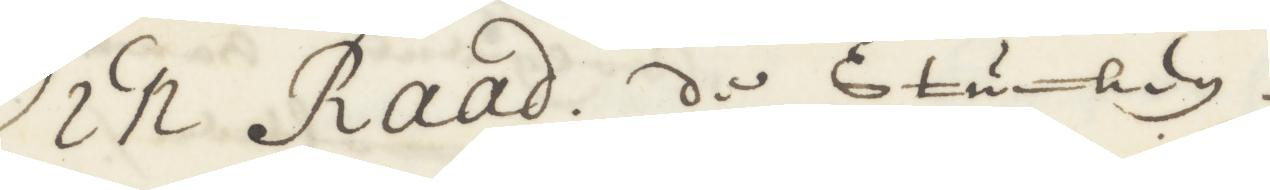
en Raad. de Stucken.
